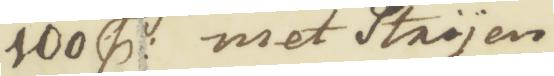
100 p:s met Strijen
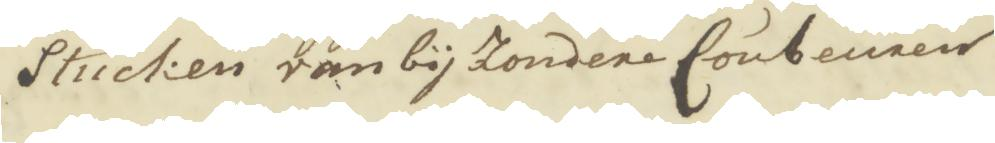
stucken van bij zondere Couleuren
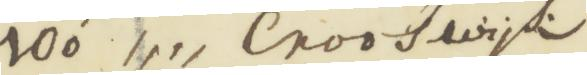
100 „„ Crooswijk
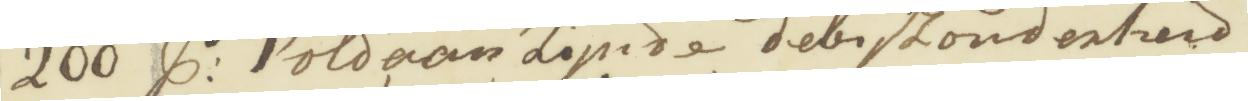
200 P:s voldaan zijnde debijzonderheid
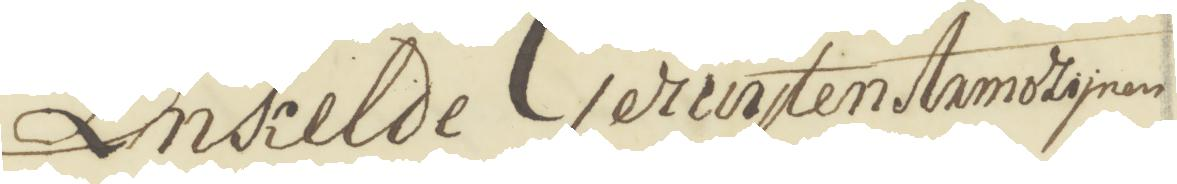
Enkelde Geruijten Armozijnen
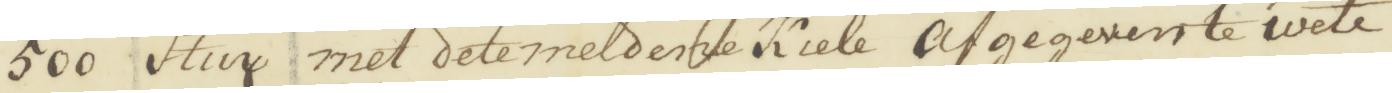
500 Stux met detemeldene Kiele afgegeven te wete
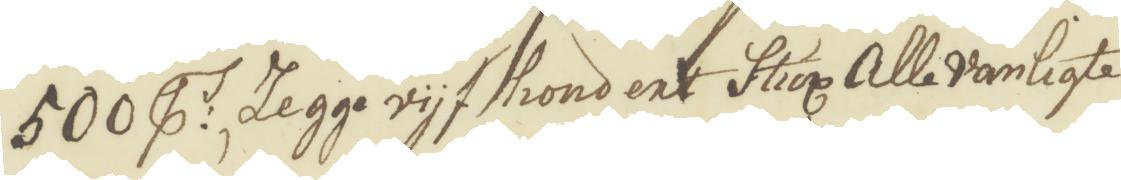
500 p:s, zegge vijf hondert stux Alle van ligte
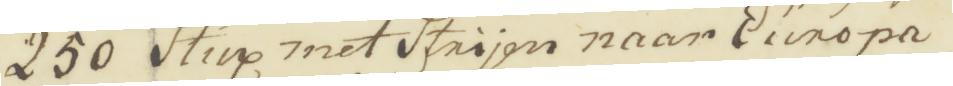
250 stux met Strijen naar Europa
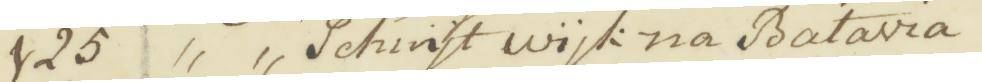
125 „ „ Schuijt wijk na Batavia
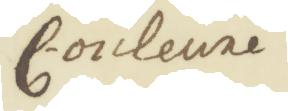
Couleure
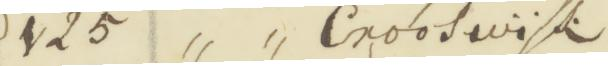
125 „ „ Crooswijk
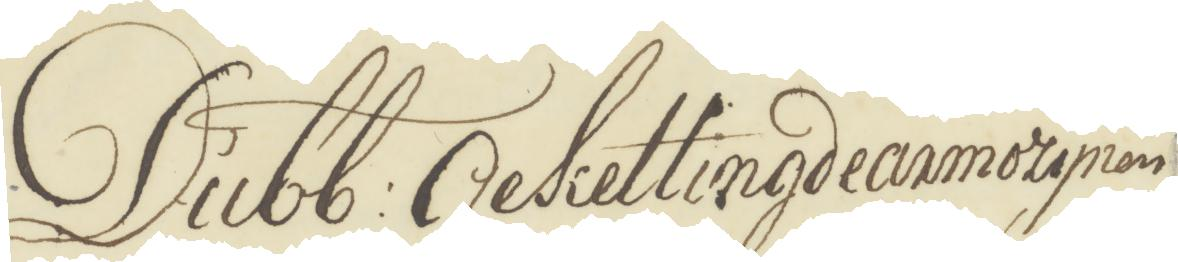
Dubb: Gekettingde armozijnen
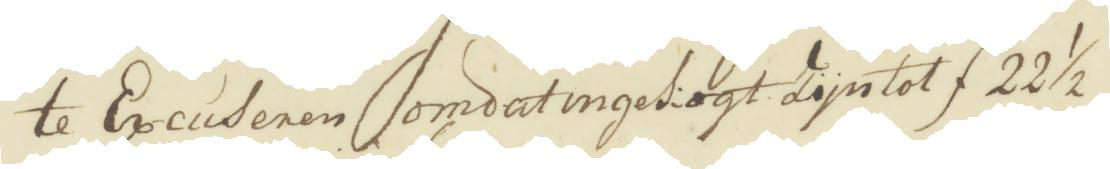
te Excuseren omdatingekogt zijn tot ƒ 22½
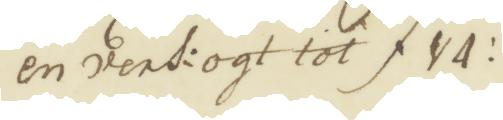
en verkogt tot ƒ 14
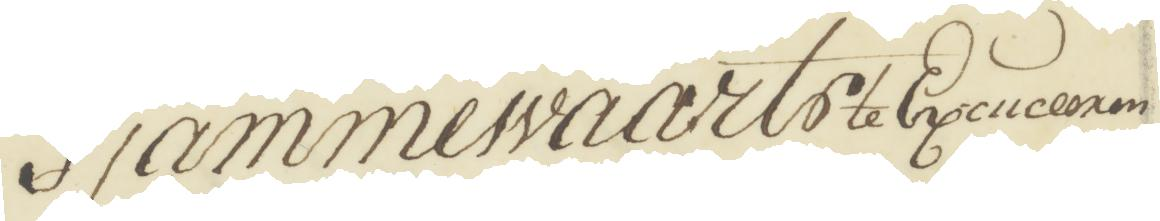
Sjammewaarts te Excuceeren
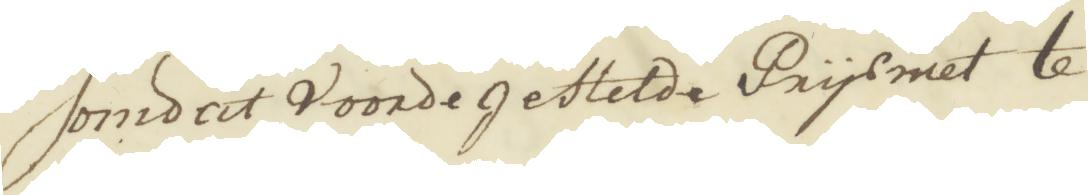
omdat voorde gestelde Prijs niet te
